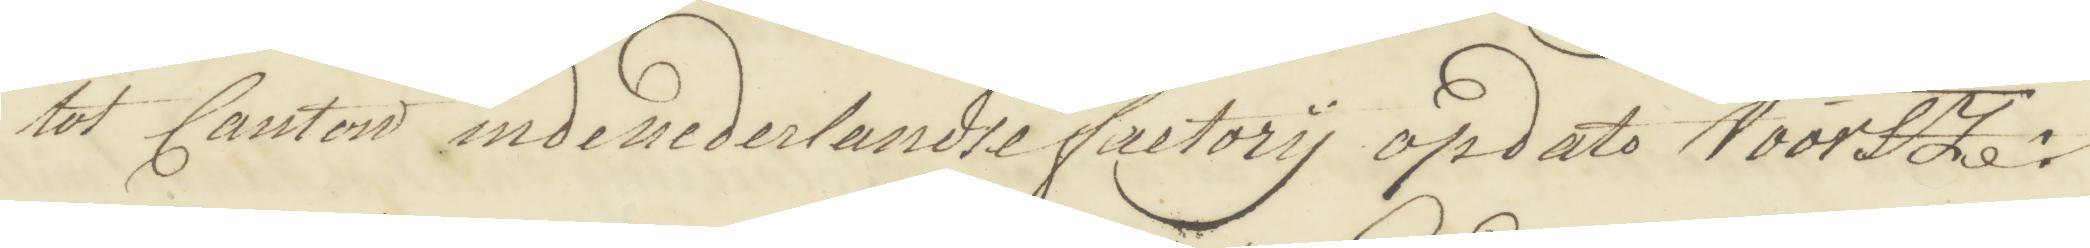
tot Canton in de nederlandse factorij op dato voorsz:
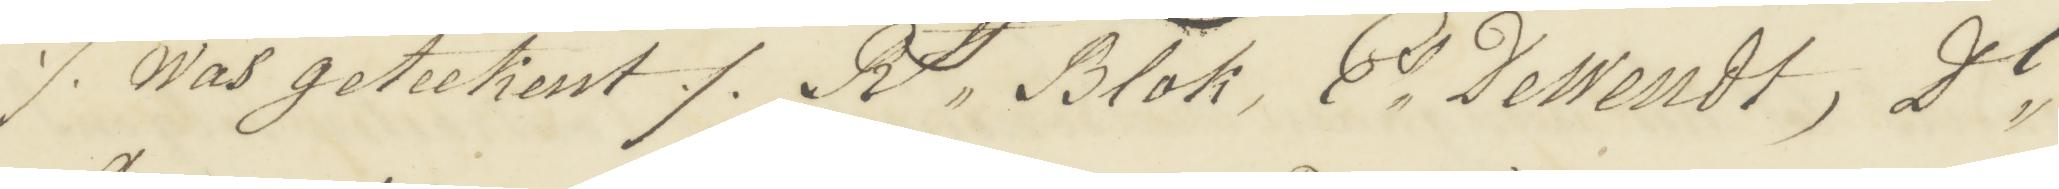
./. was geteekent ./. R„f Blok, E„s Dewendt, D„l
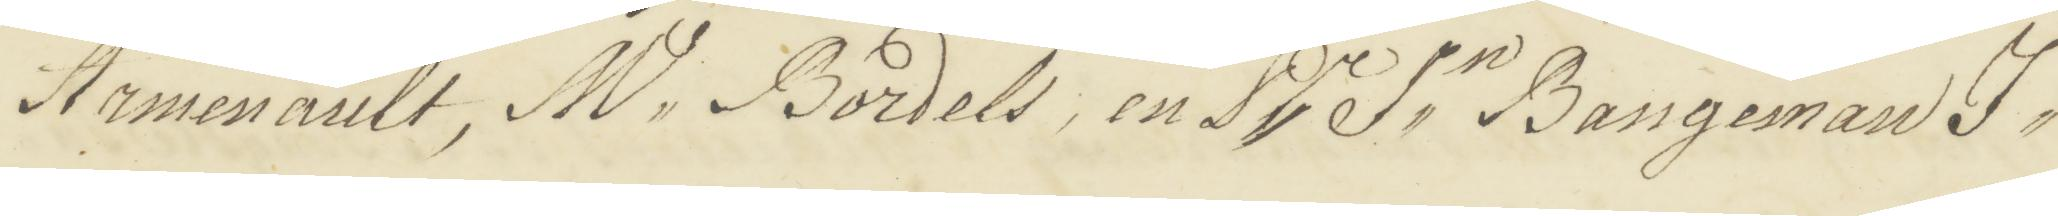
Armenault, M„s Bordels, en P„r I„n Bangeman I„r
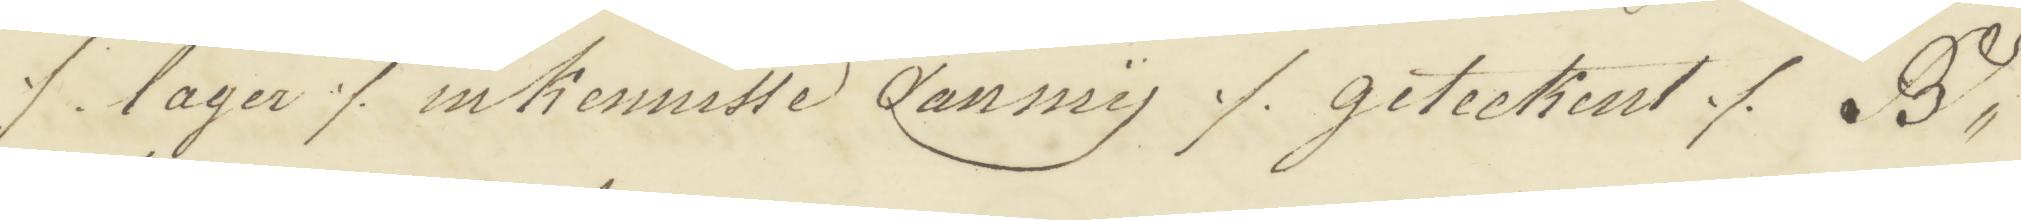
./. lager ./. in kennisse van mij ./. geteekent ./. B„s
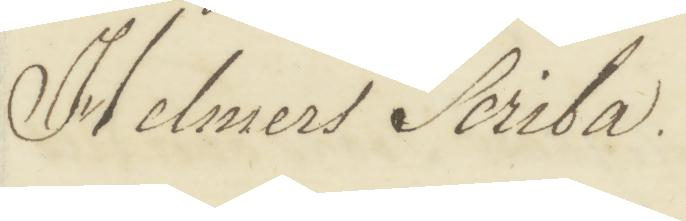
Helmers scriba.
